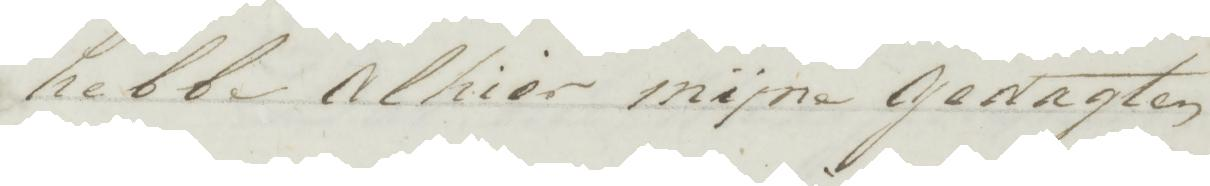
hebbe alhier mijne gedagten
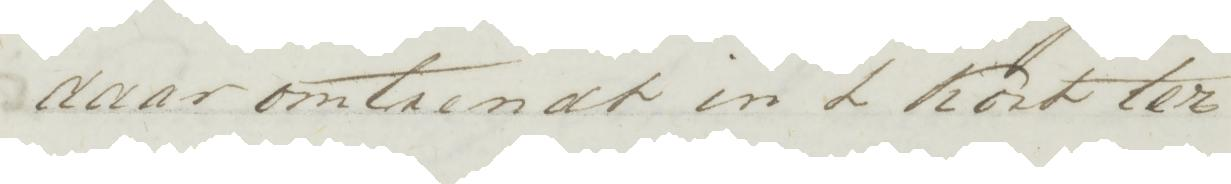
daar omtrendt in ’t kort ter
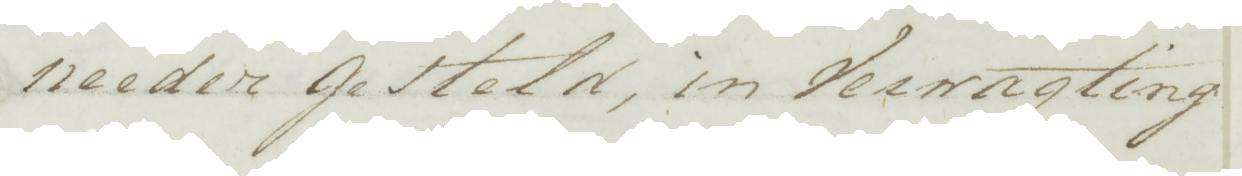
needer gesteld, in verwagting
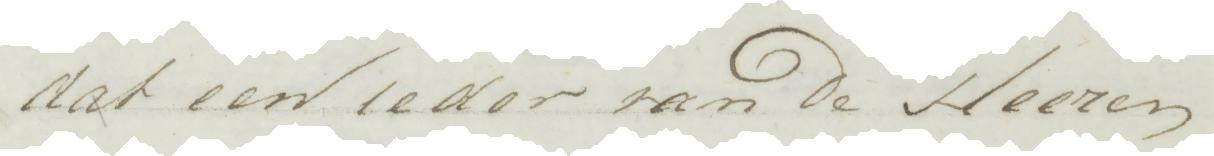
dat een ieder van de Heeren
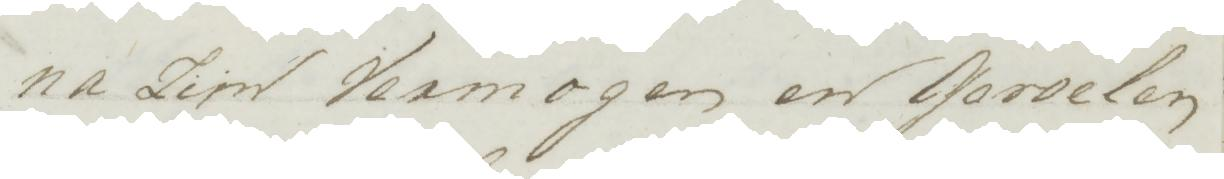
na zijn vermogen en gevoelen
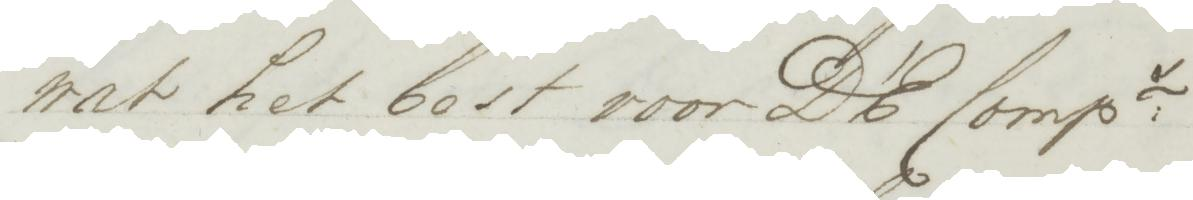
wat het bost voor D'E Comp:s
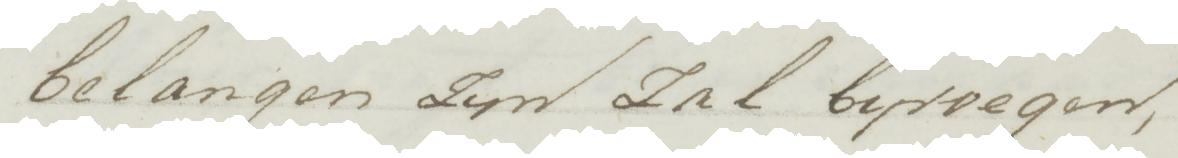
belangen zyn zal byvoegen,
